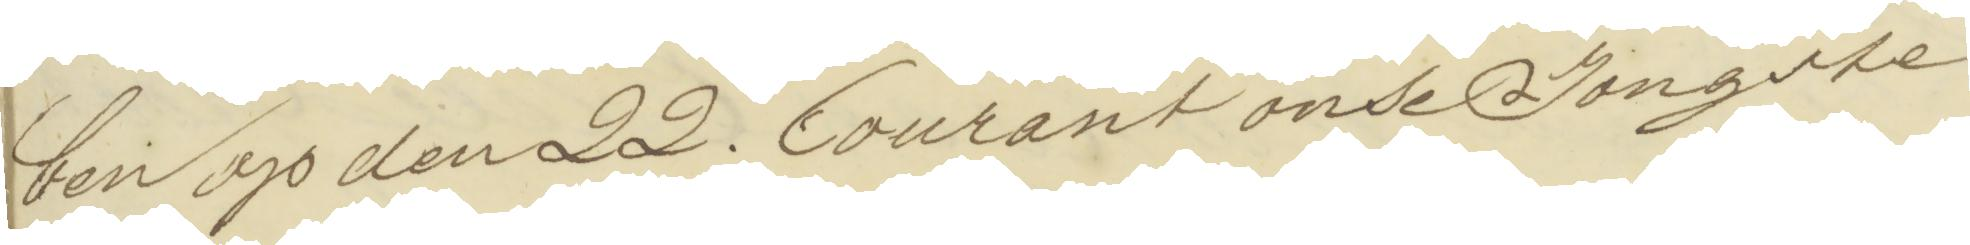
ben op den 22.en Courant onse Jongste
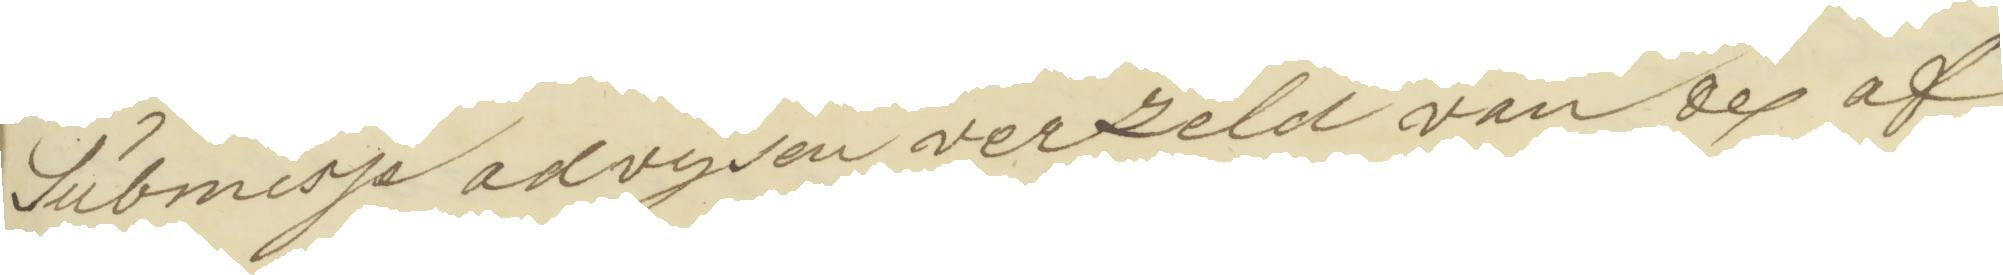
submisse advijsen verzeld van de af
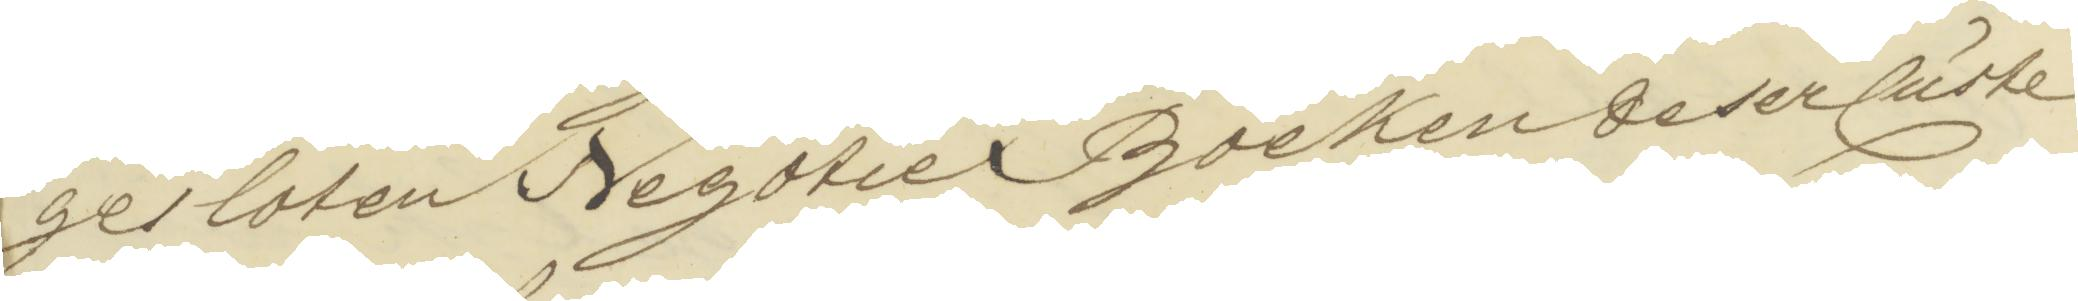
gesloten Negotie Boeken deser Custe
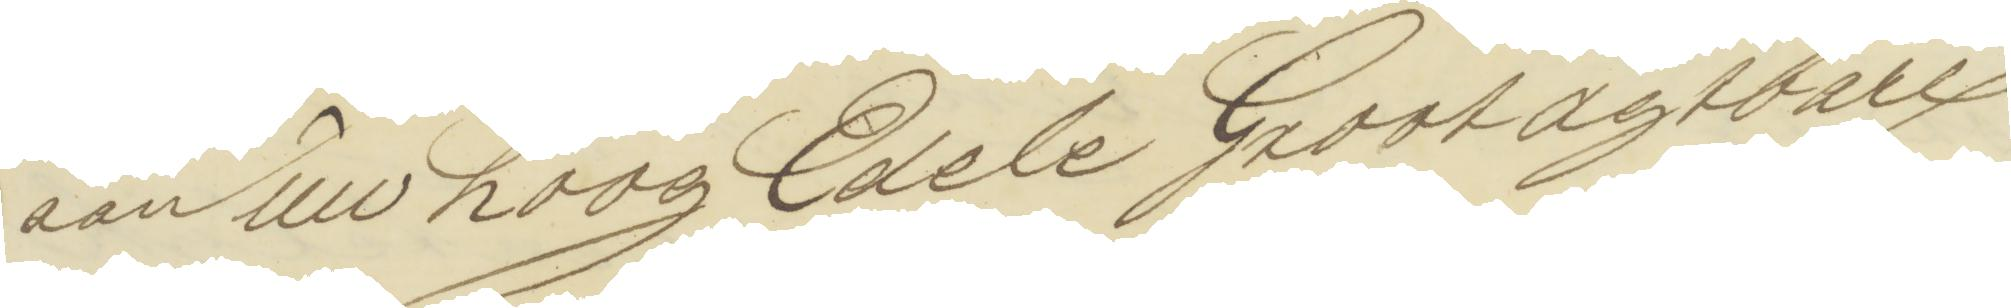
aan uw hoog Edele Groot agtbare
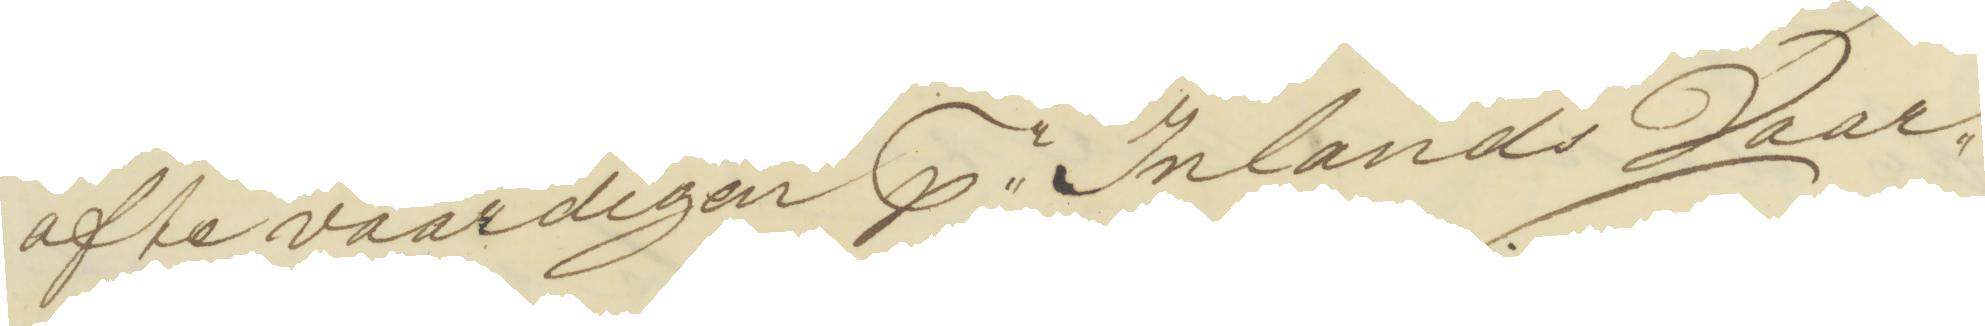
afte vaardigen p„r Inlands Vaar„
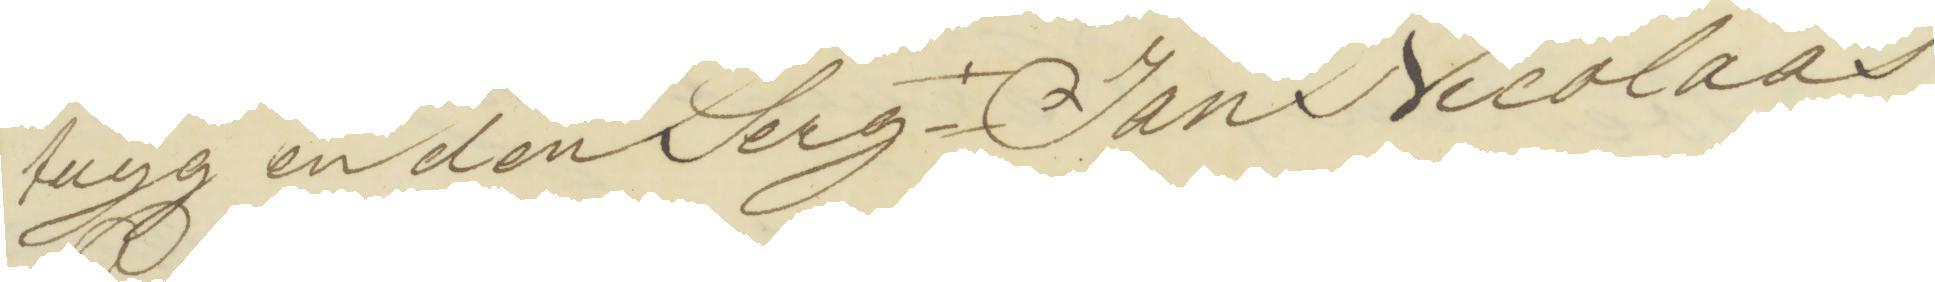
tuijg en den serg=t Jan Nicolaas
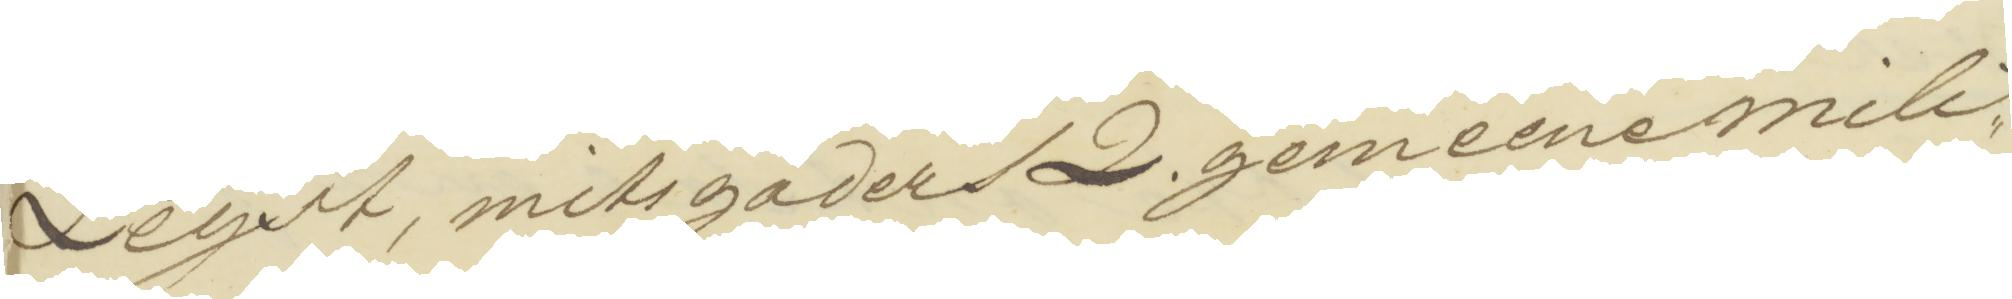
Leijst, mitsgaders 2. gemeene mili„
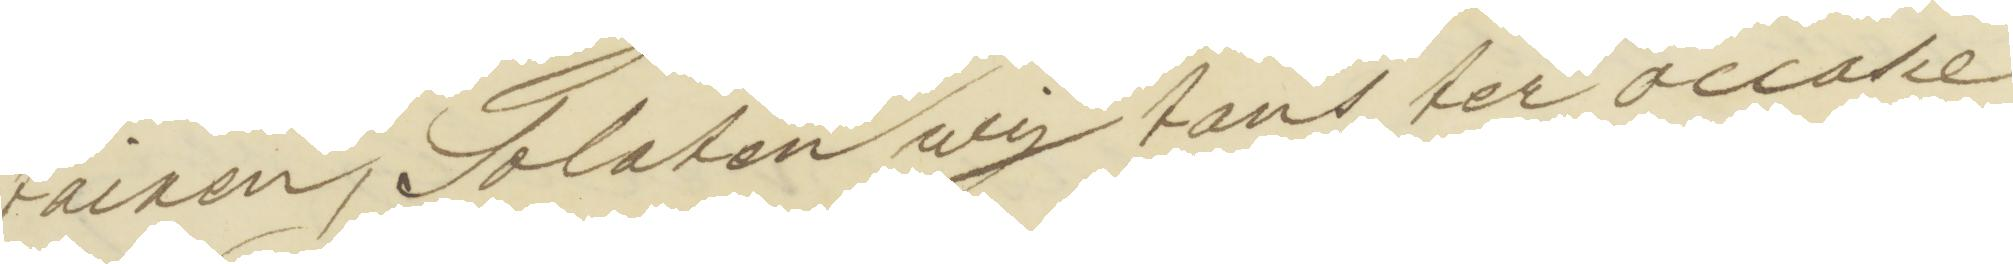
tairen, solaten wij tans ter occasie
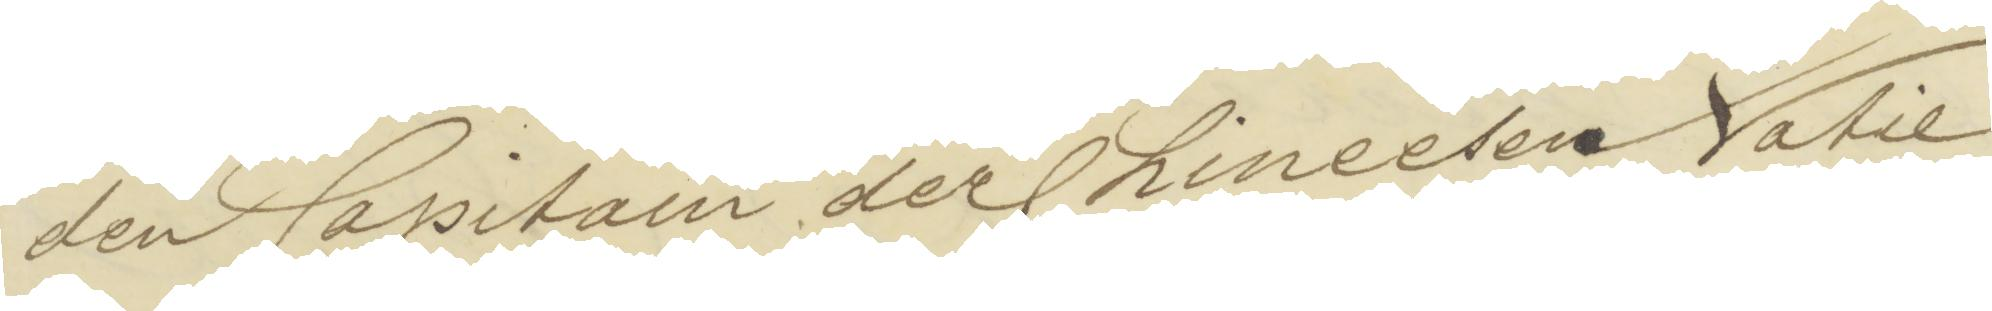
den Capitain der Chineesen Natie
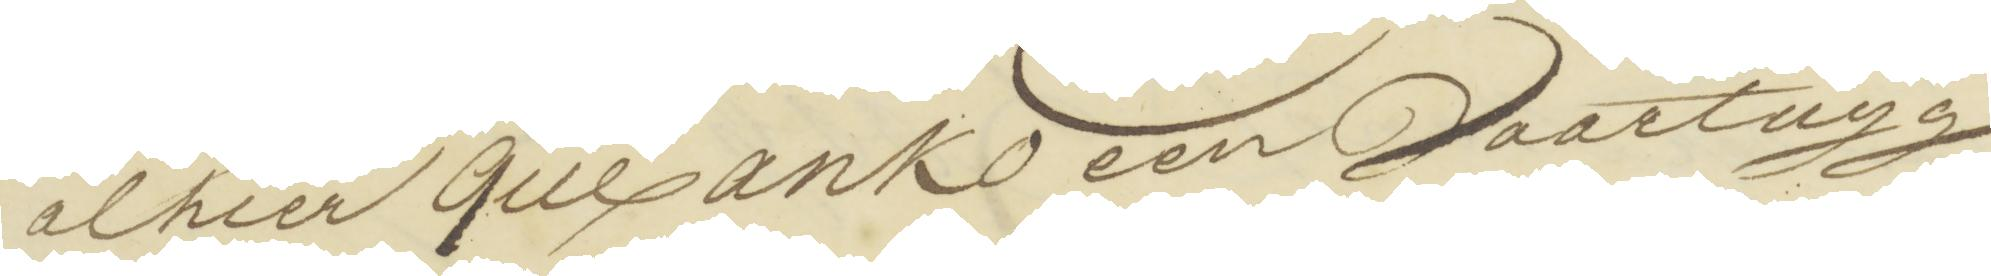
alhier queanko een Vaartuijg
